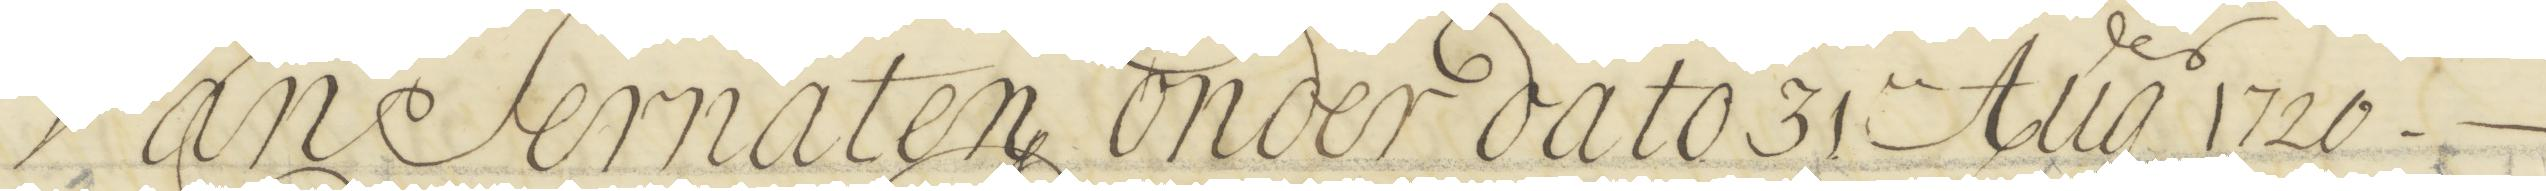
Van Ternaten onder dato 31:n Aug: 1720 - —
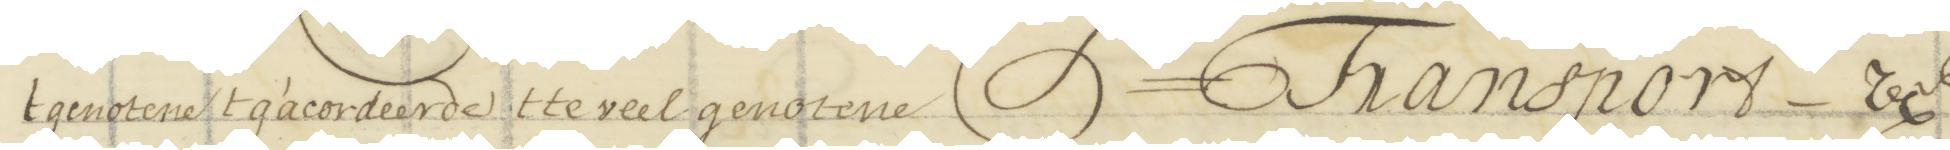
t genotene t g'acordeerde t te veel genotene P=r Transport — rxs
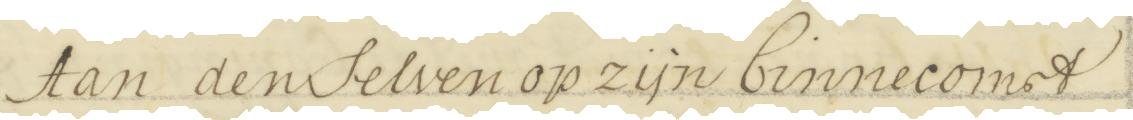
Aan denselven op zijn binnecomst
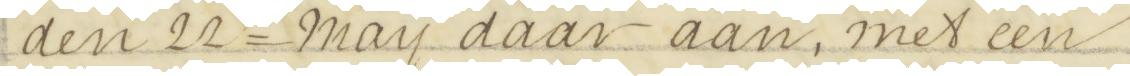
den 22=en maij daar aan, met een
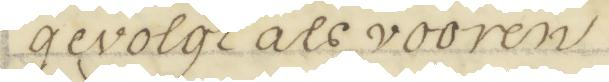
gevolgh als vooren
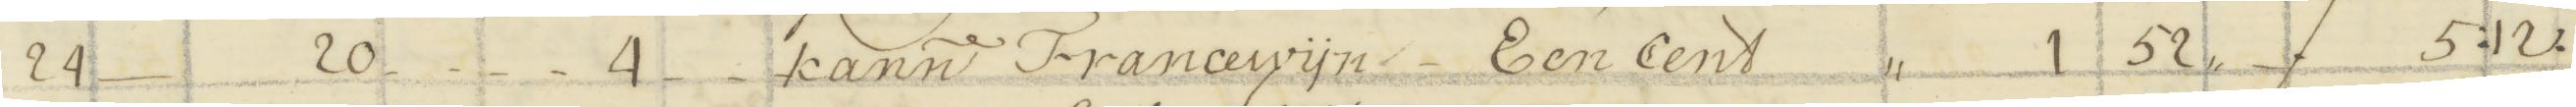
24 — 20 - - - - 4 - - -kann Francewijn - Een cent „ 1 52„ —ƒ 5:12:
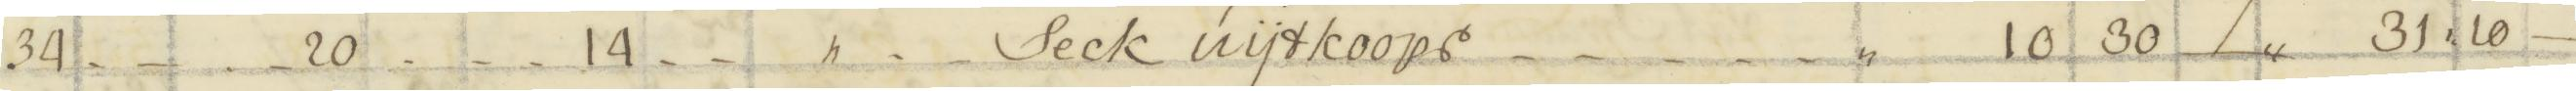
34 - - . - 20 - - - 14 - - „ - - Seck uijtkoops - - - - - „ 10 30 —„ 31:10—
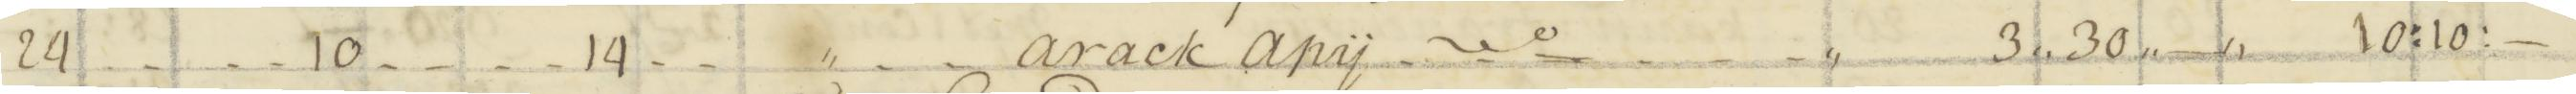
24 - - - - 10 - - - - 14 - - „ - - arack apij - _o - - - - „ 3„ 30„ —„ 10:10: —
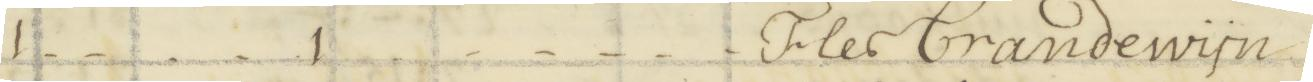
1 - - - - 1 - - - - - - Fles brandewijn
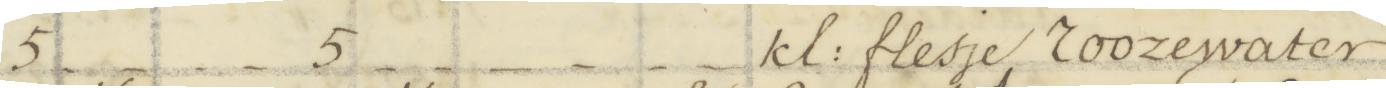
5 - - - - 5 - - - - - - kl: flesje roozewater
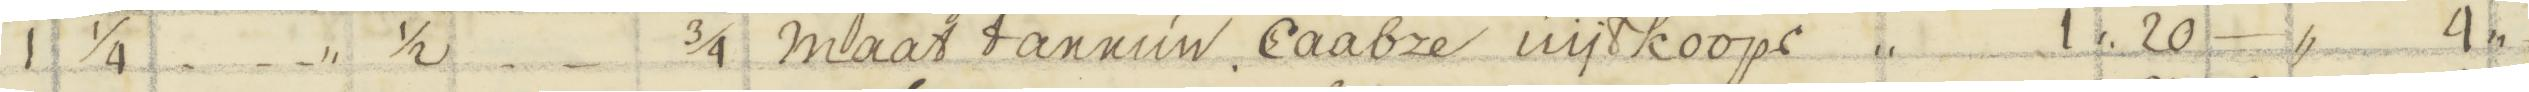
1¼ - - - „ ½ - - ¾ maat tarruw Caabze uijtkoops „ 1„ 20 —„ 4„
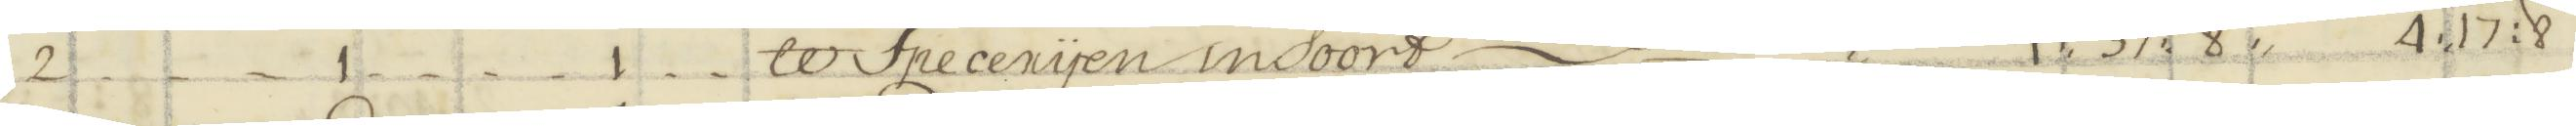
2 - - - 1 - - - - 1 - - lb specerijen in soort _=o „ 1„ 37„ 8„ 4:17:8
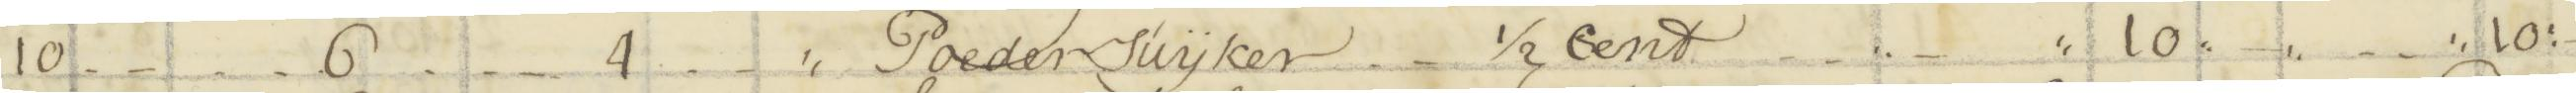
10 - - - - - 6 - - - - 4 - - „ Poeder Suijker - - ½ Cent - - „ - 10 „ —„ - - „10:
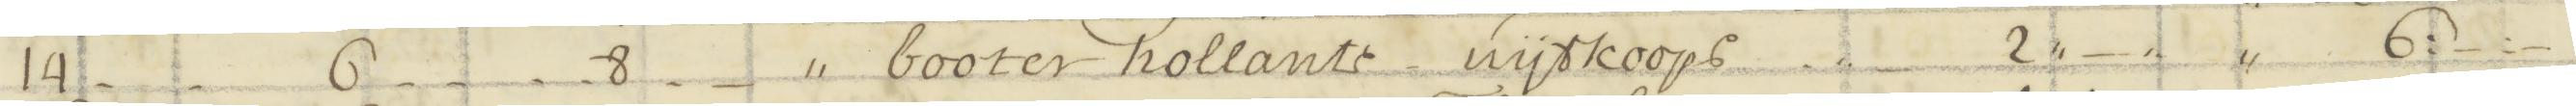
14 - - 6 - - - - 8 - - „ booter hollants uijtkoops - „ 2„ — „ „ 6: — : —
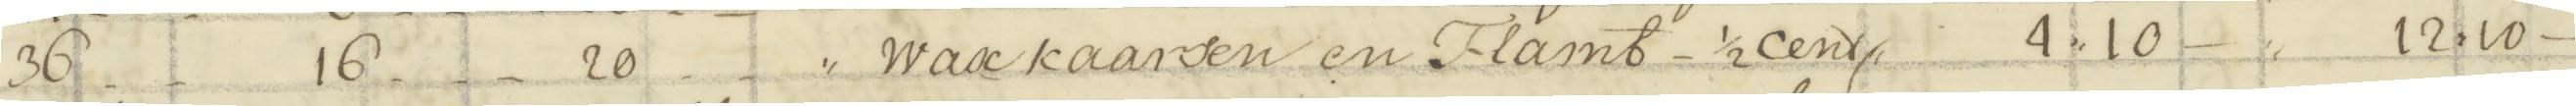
36 - - 16 - - - 20 - - „ wax kaarsen en Flamb - ½ cent„ 4 „ 10 — „ 12:10—
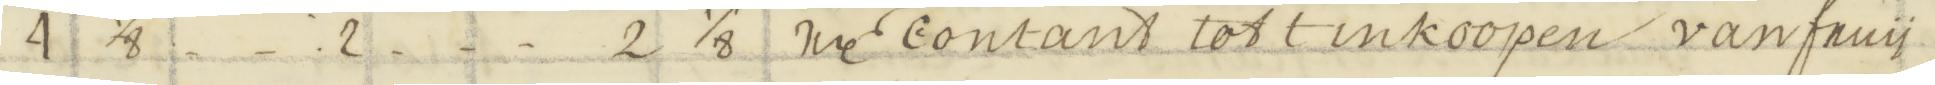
4 1/8 - - . 2 - - - 2 1/8 rxs contant tot t inkoopen van fruij
